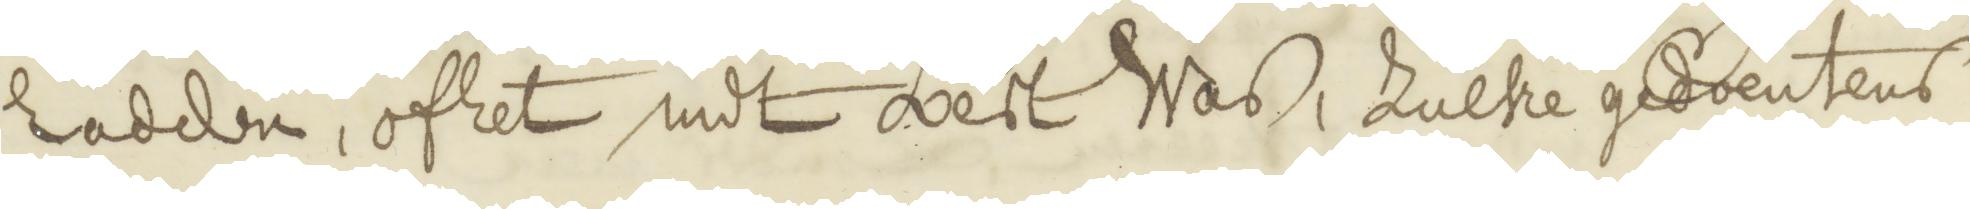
hadden, ofhet niet best was, zulke gedoentens
